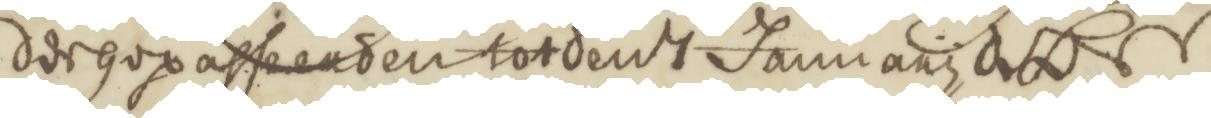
des gepasseerden tot den 7' Ianuarij deses
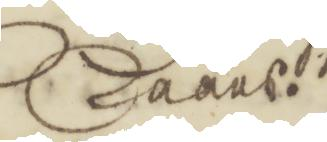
Iaars.
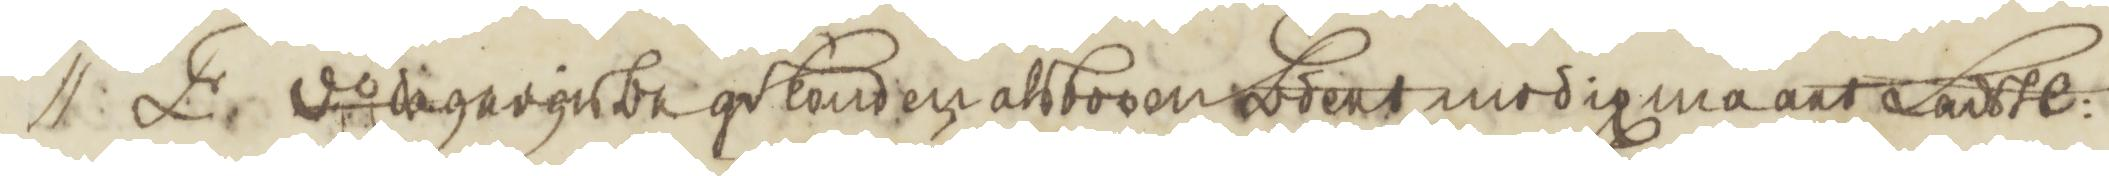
„: E: d.o dagregister gesonden alsboven sedert medio maart laestl:
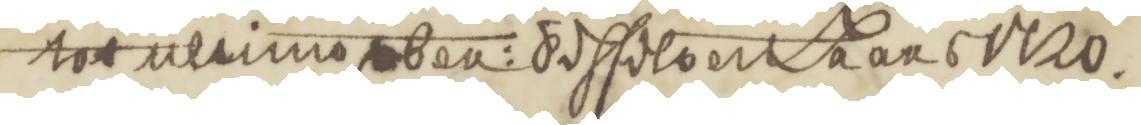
tot ultimo xber: desselven Iaars 1720.
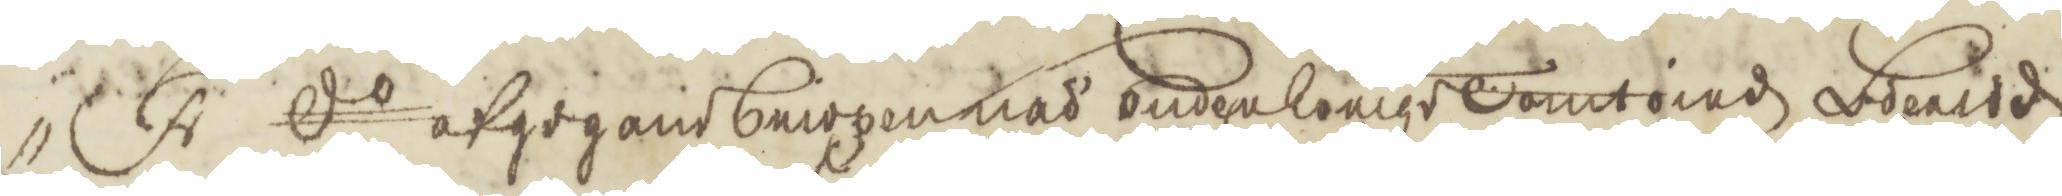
„ F d=o afgegane brieven nad' onderhorige comtoiren sedert den
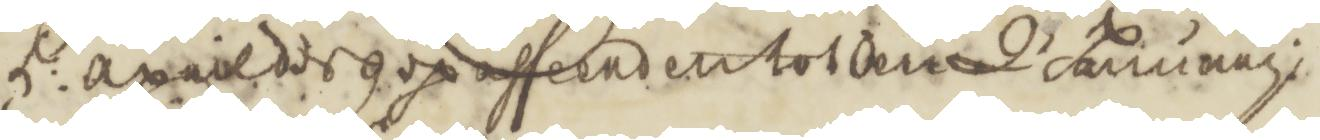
5:' april des gepasseerden tot den 2' Ianuarij
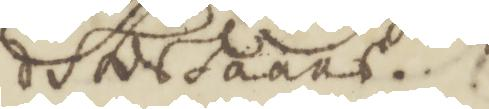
deses Iaars.
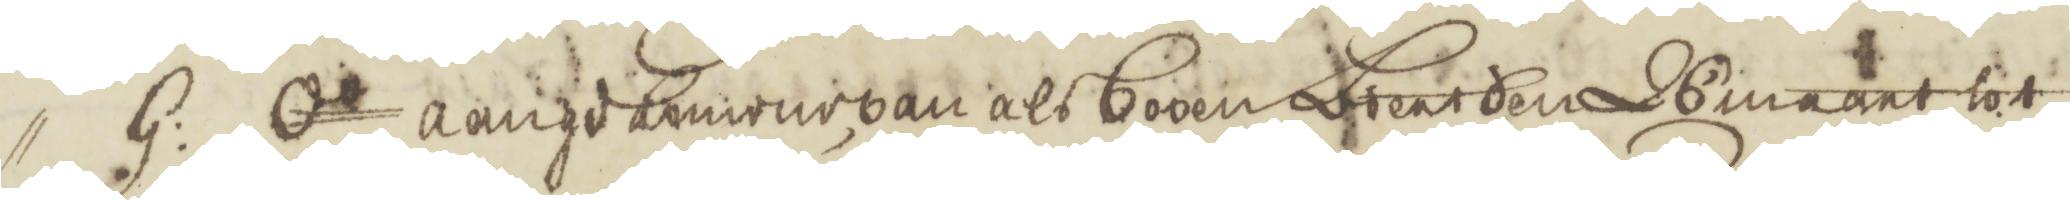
„ G: d=o aangekomen, van als boven sedert den 26' maart tot
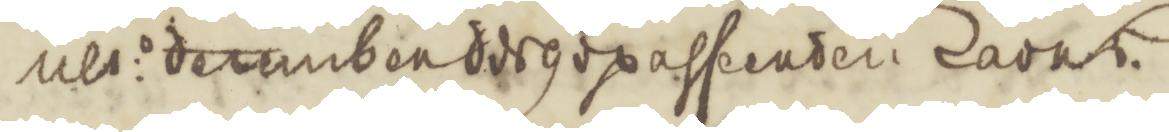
ult:o december des gepasseerden Iaers.
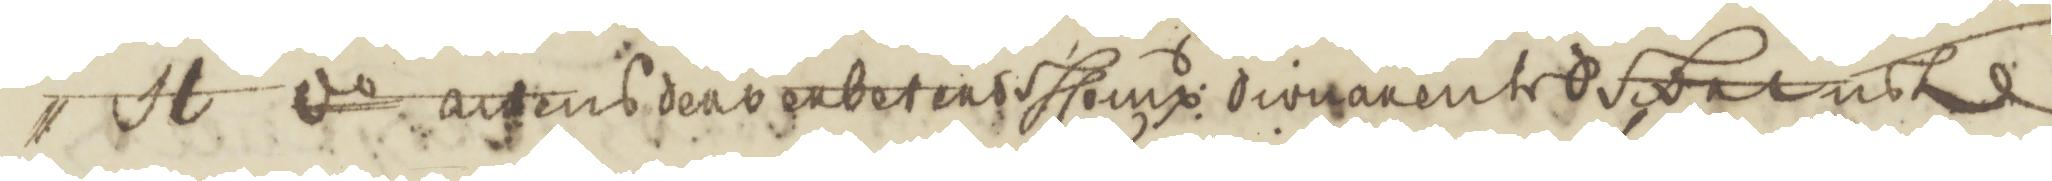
„ H d=o actens der verbeterde 'sComp:s dienaren te deser custe
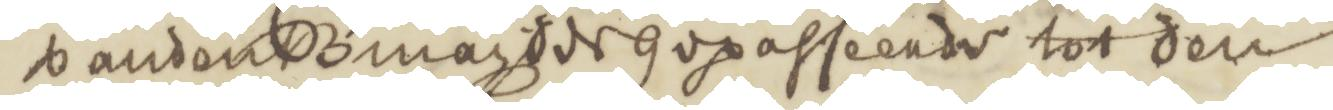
vanden 13' maij der gepasseerde tot den
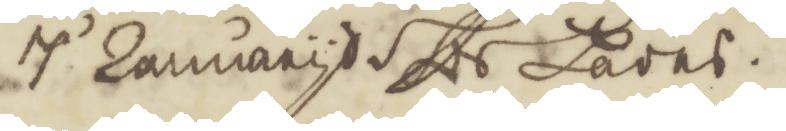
7' Ianuarij deses Iaers.
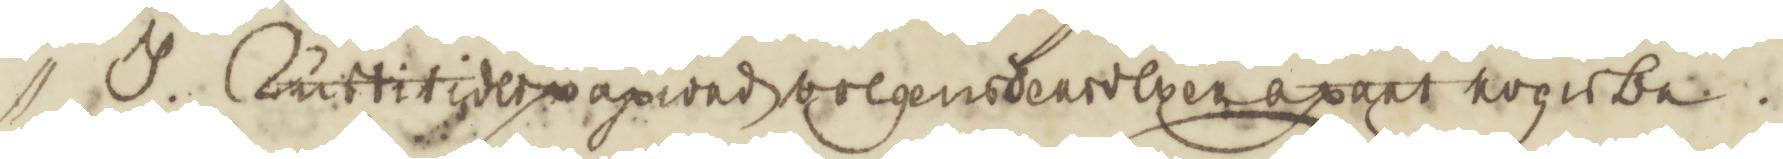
„ I. Iustitiele papieren volgens der selven apart register.
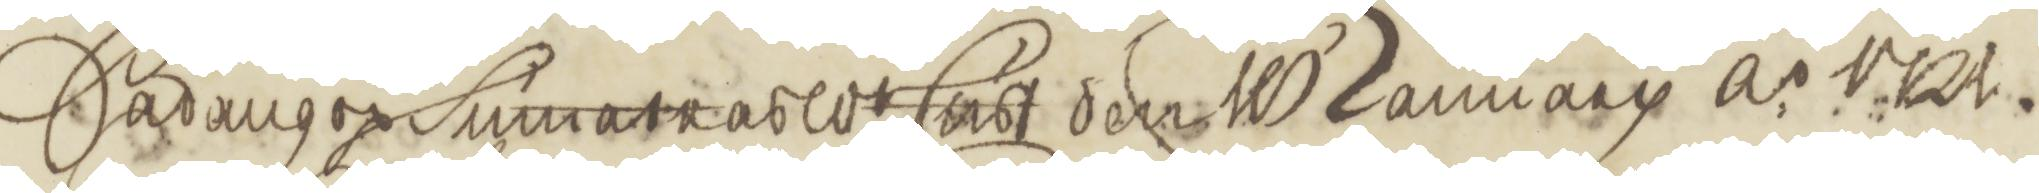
Padang op Sumatras W: Cust den 18' Ianuarij a,o 1721.
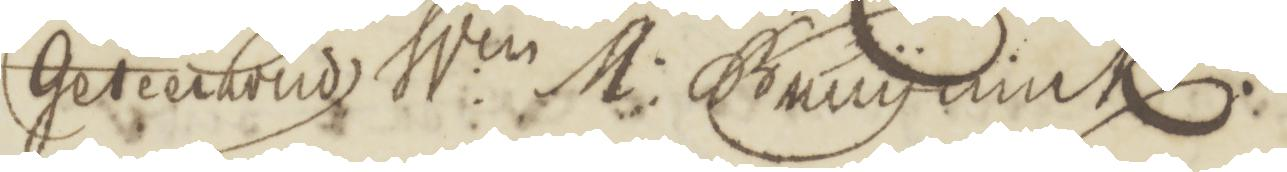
(Geteekend) W:m M: Bruijnink:
